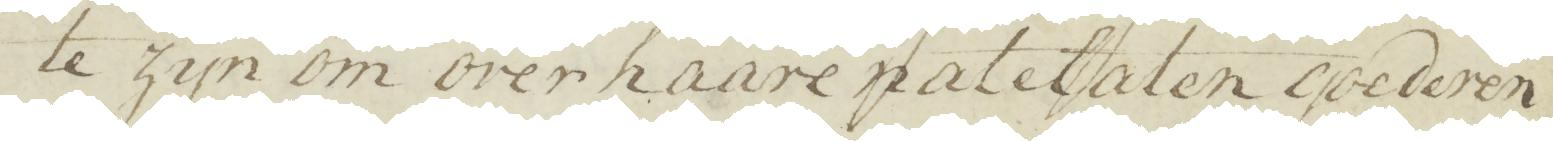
te zyn om over haare natelaten goederen
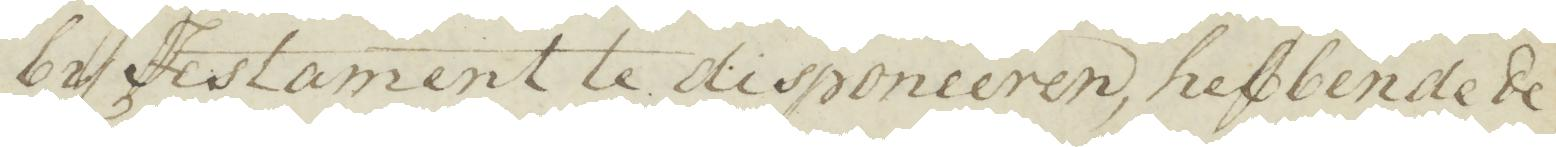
by Testament te disponeeren, hebbende de
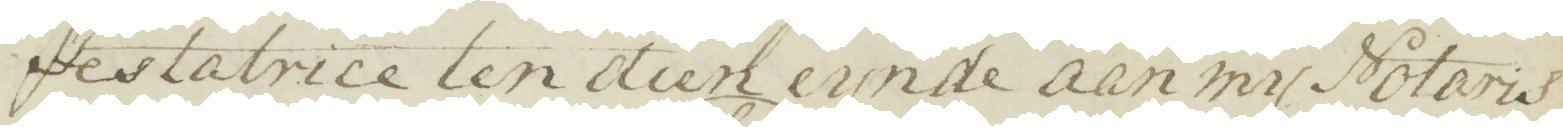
Testatrice ten dien eynde aan my Notaris
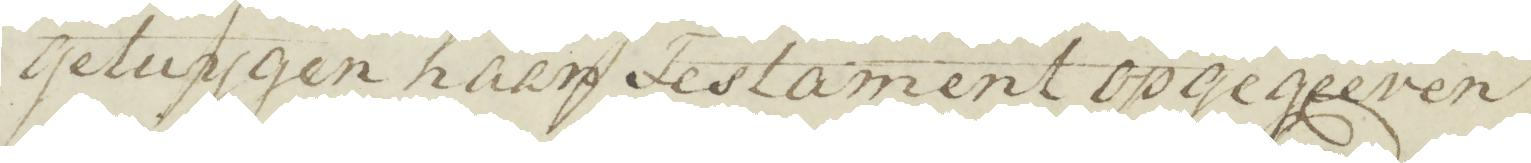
getuygen haar Testament opgegeeven
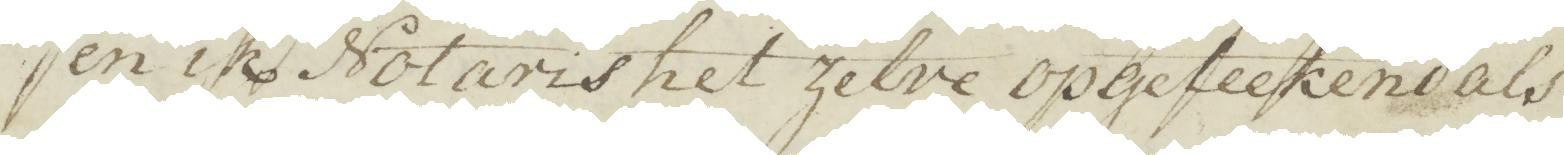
en ik Notaris het zelve opgeteekend als
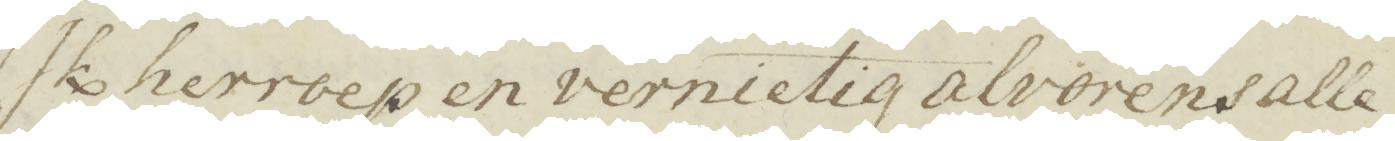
Ik herroep en vernietig alvorens alle
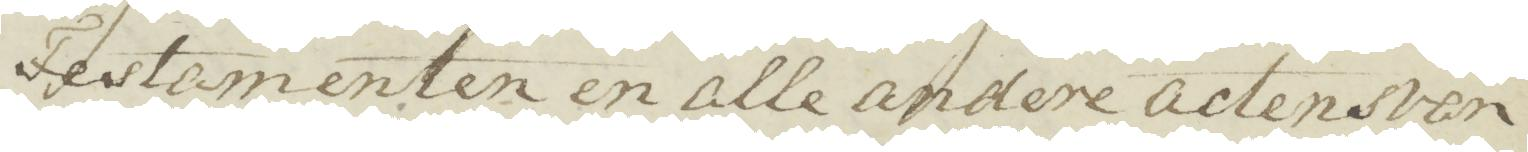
Testamenten en alle andere actens van
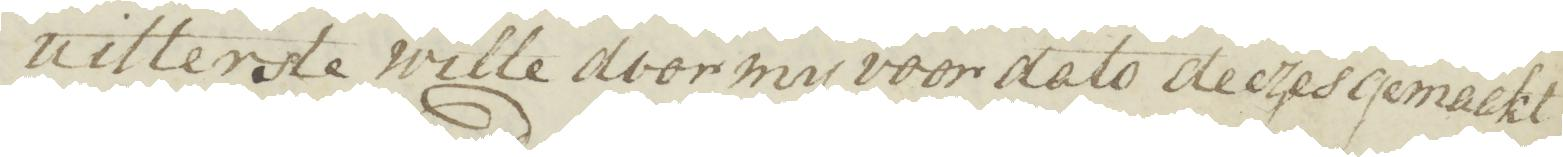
uitterste wille door my voor dato deezes gemaakt
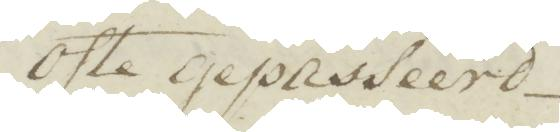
ofte gepasseerd—
